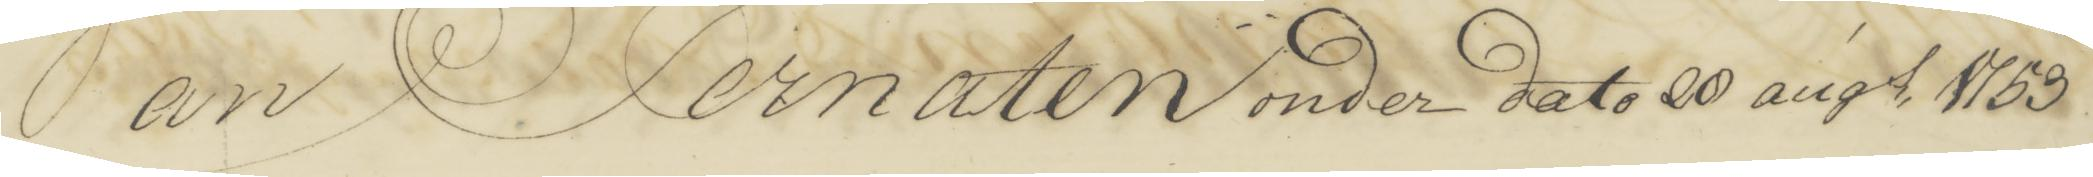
Van Ternaten onder dato 28 aug„s 1753
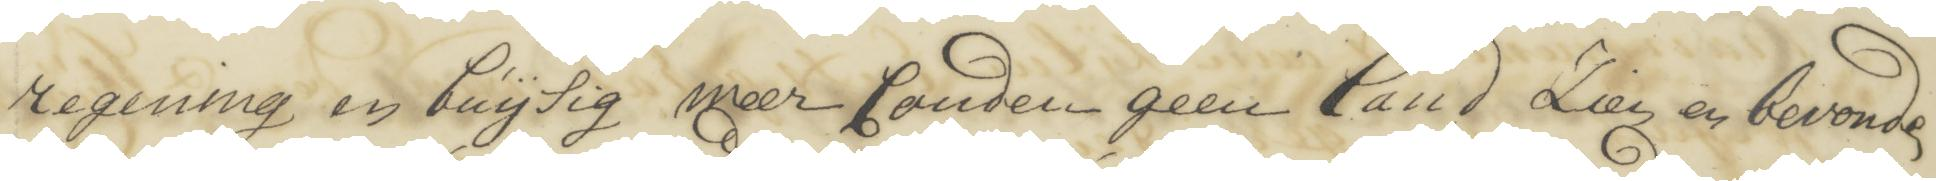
regening en buijsig meer Conden geen land zien en bevonden
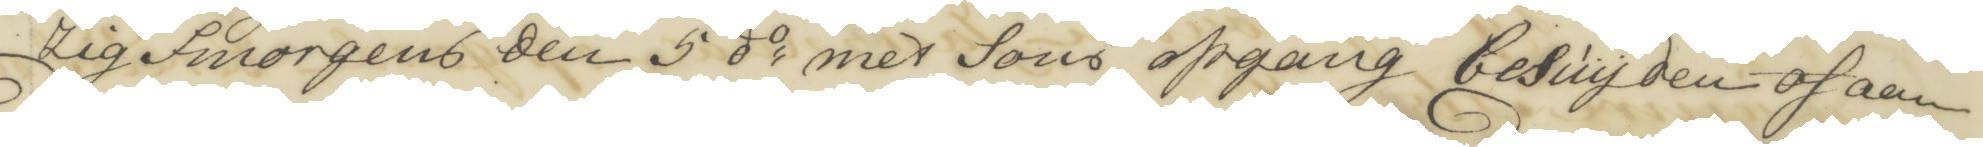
zig smorgens den 5 d„o met sous opgang besuijden of aan
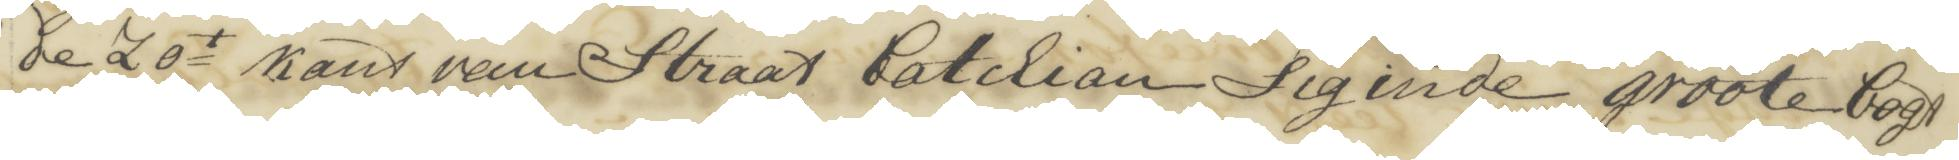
de zo=t kant van Straat batchian sig inde groote bogt
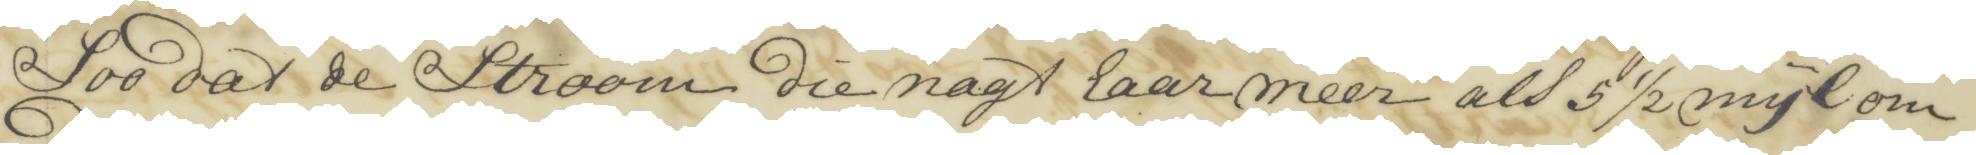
soo dat de stroom die nagt haar meer als 5½ mijl om
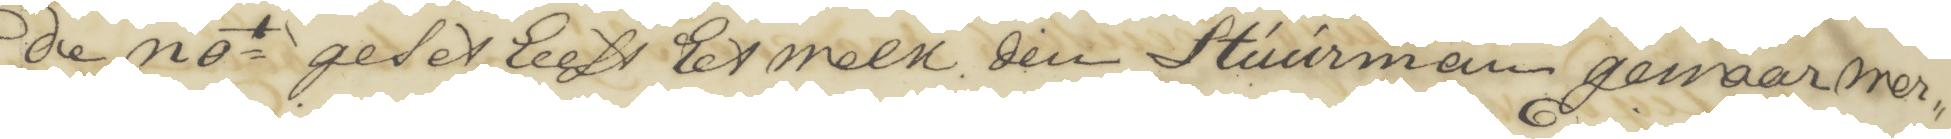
de no=t geset heeft het welk den stuurman gewaar wer„
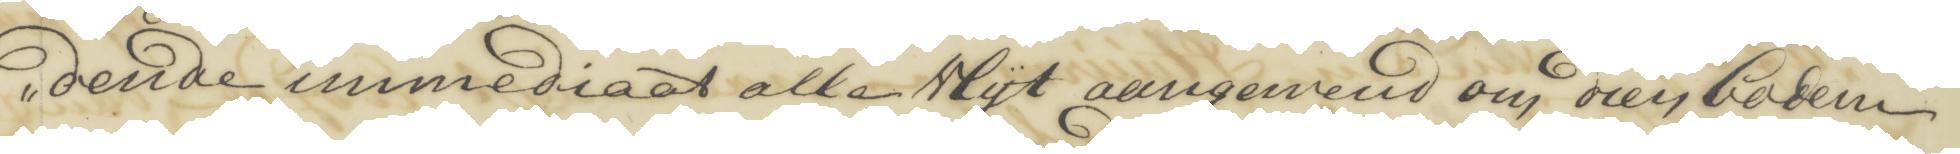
„dende immediaat alle vlijt aangewend om dien bodem
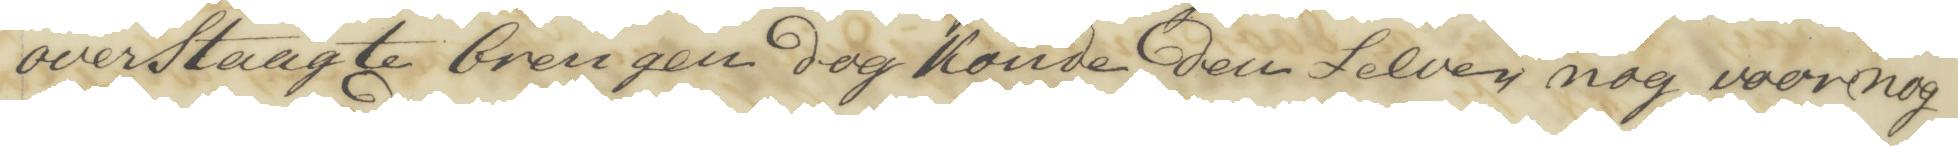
overstaag te brengen dog konde den selven nog voor nog
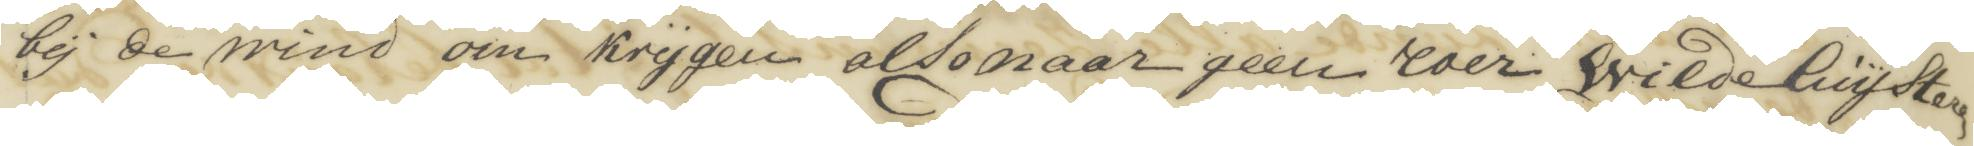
bij de wind om krijgen also naar geen roer wilde luijsteren
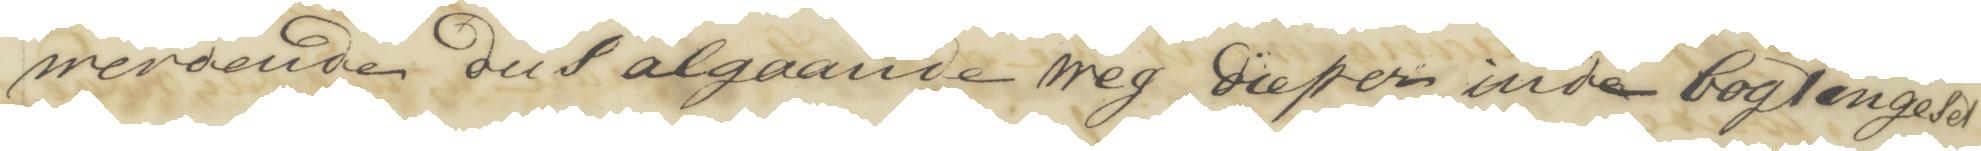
werdende dus algaande weg dieper inde bogt ingeset
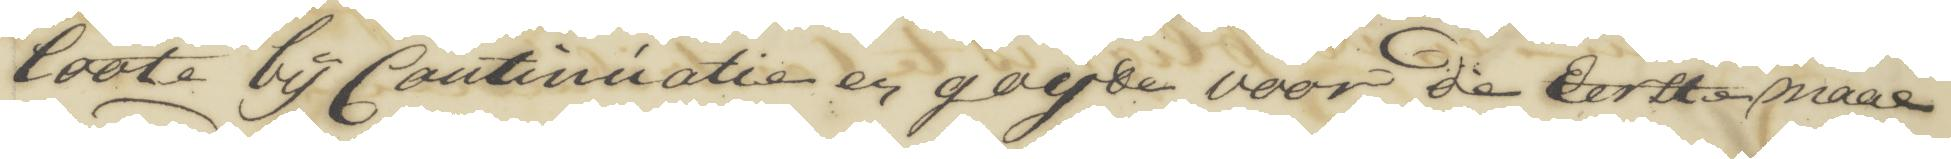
laate bij Continuatie en goyde voor de Eerste maal
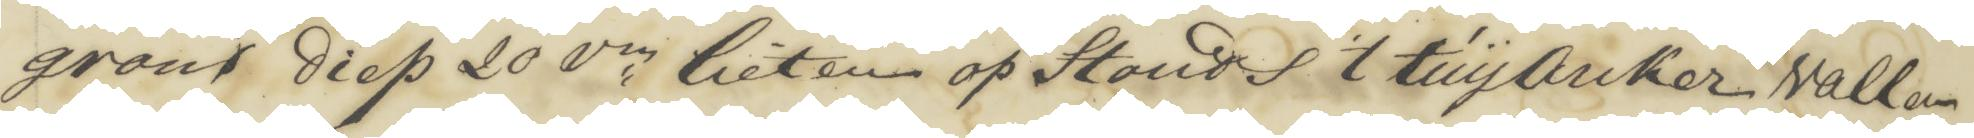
grond diep 20 v„m lieten op stonds ’t tuijanker vallen
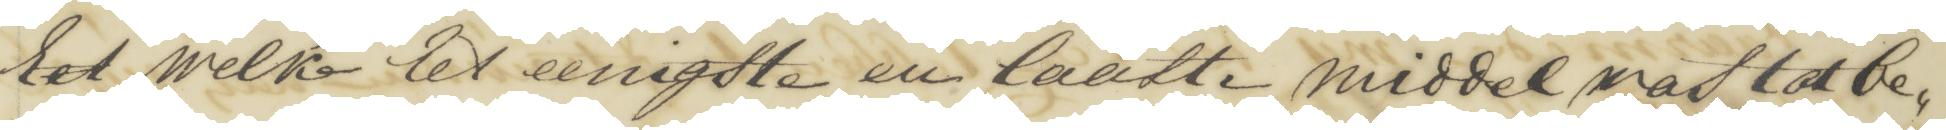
het welke het eenigste en laaste middel was tot be„
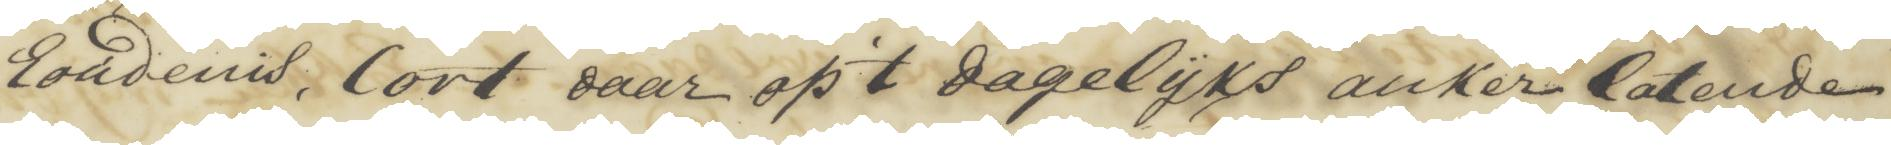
houdenis, Cort daar op ’t dagelijks anker latende
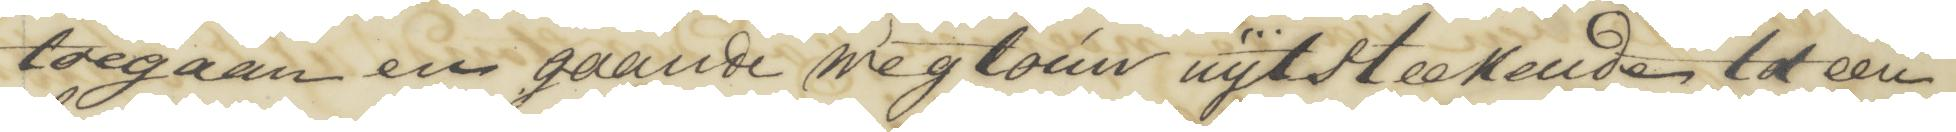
toegaan en gaande weg touw uijtsteekende tot een
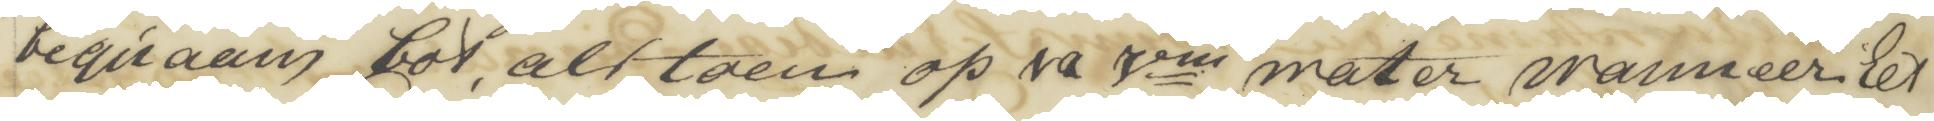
bequaam bot, als toen op 10 v=m water wanneer het
